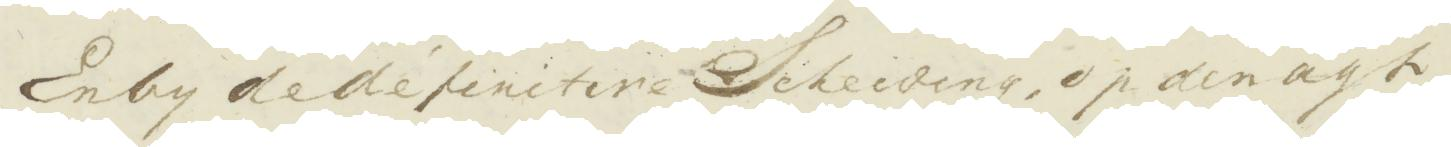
En by de définitive scheiding, op den agt
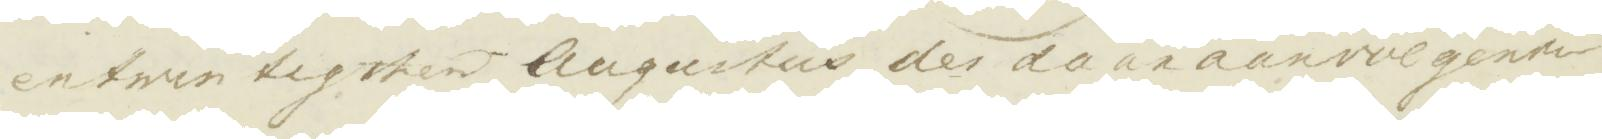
en twintigsten augustus des daaraan volgende
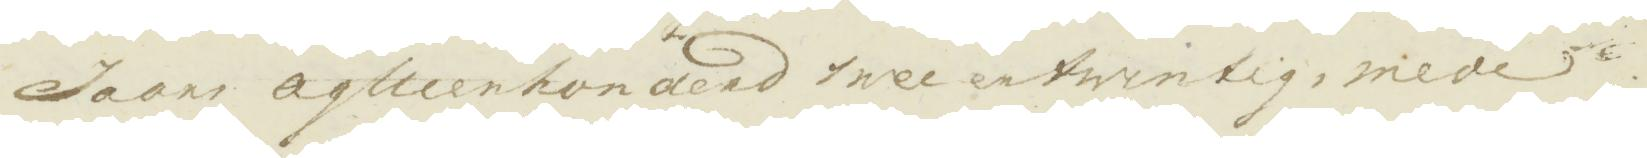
Iaars agttien honderd twee en twintig, mede
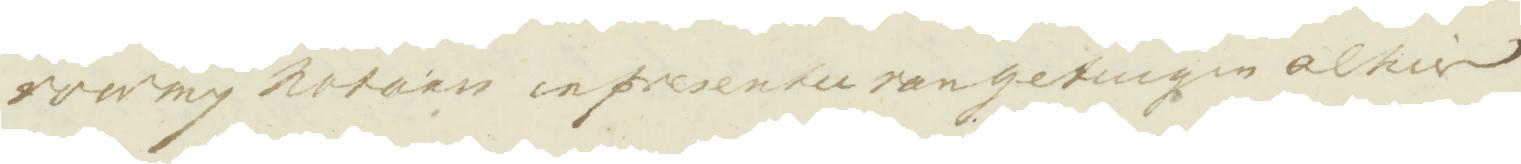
voor my notaris in presentie van getuigen alhier
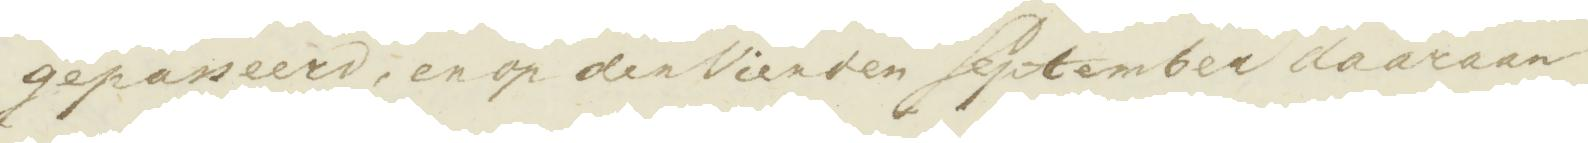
gepasseerd, en op den Vierden September daaraan
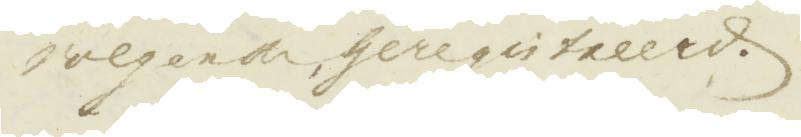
volgende, geregistreerd.
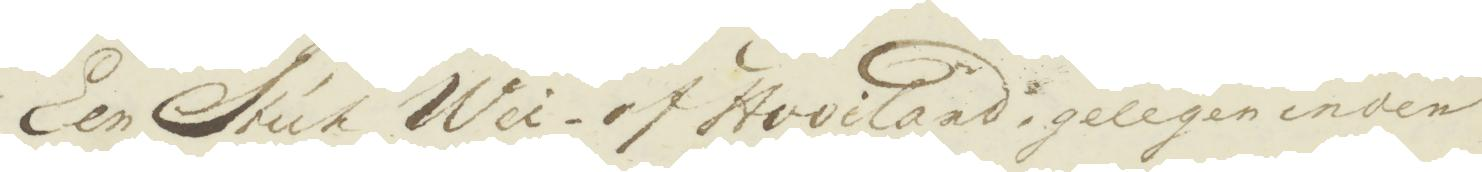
Een Stuk Wei- of Hooiland, gelegen in den
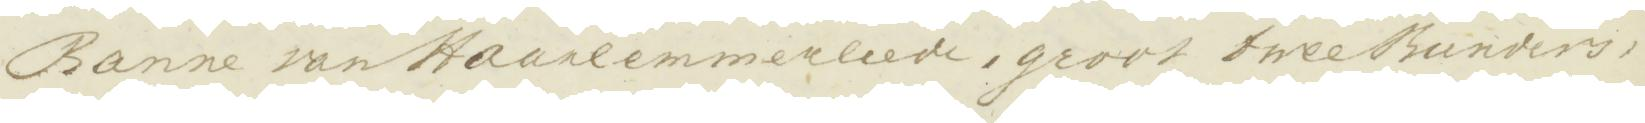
Banne van Haarlemmerliede, groot twee Bunders,
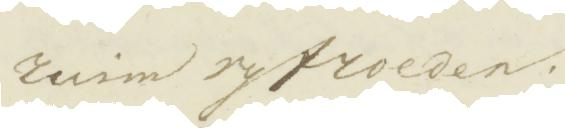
ruim vyf roeden.
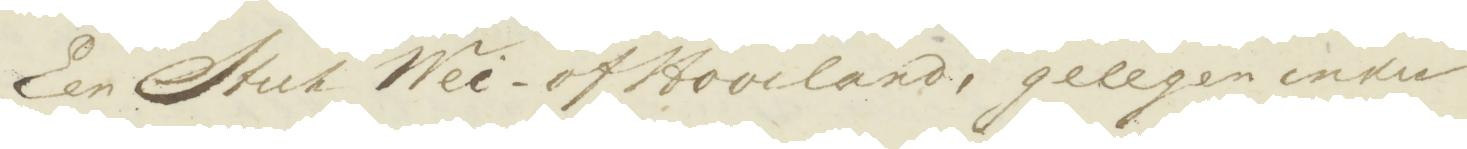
Een Stuk Wei- of Hooiland, gelegen in die
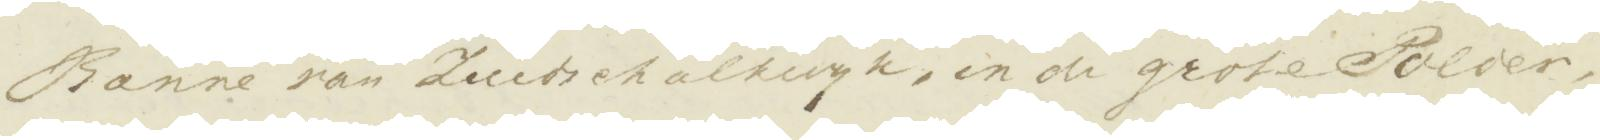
Banne van Zuidschalkwyk, in de grote Polder,
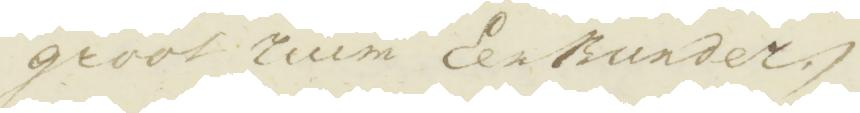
groot ruim Een Bunder.
